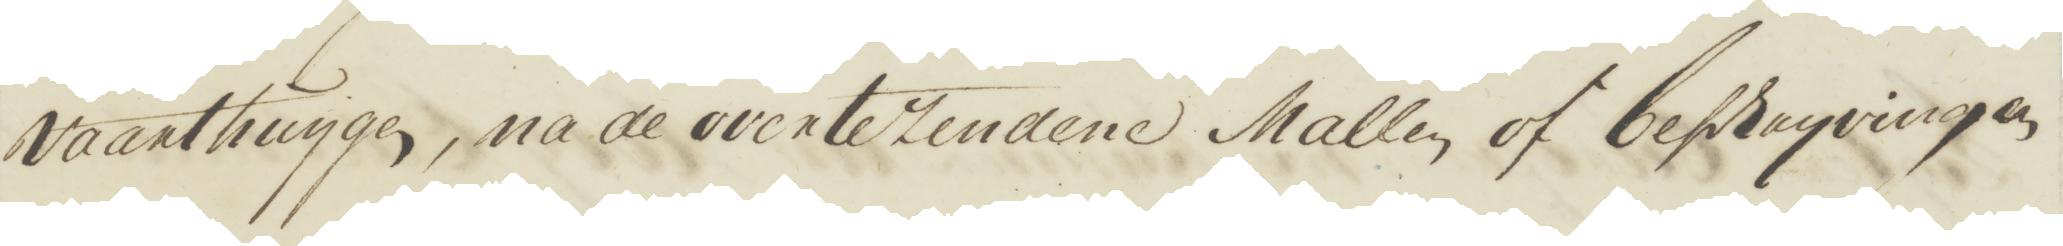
vaarthuijgen, na de overtezendene Mallen of beschryvingen
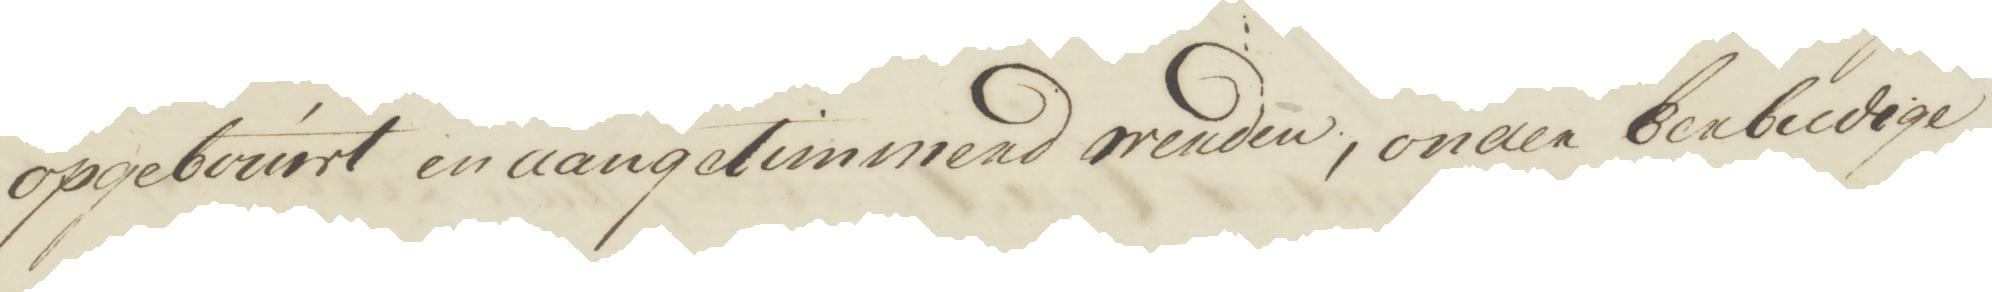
opgebouwt en aangetimmerd werden, onder Eerbiedige
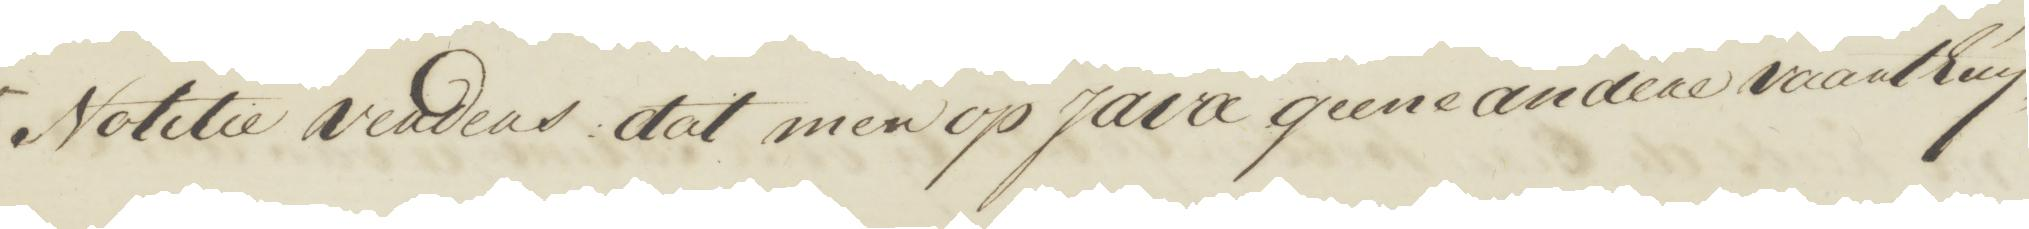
Notitie verders dat men op Java geene andere vaarthuij„
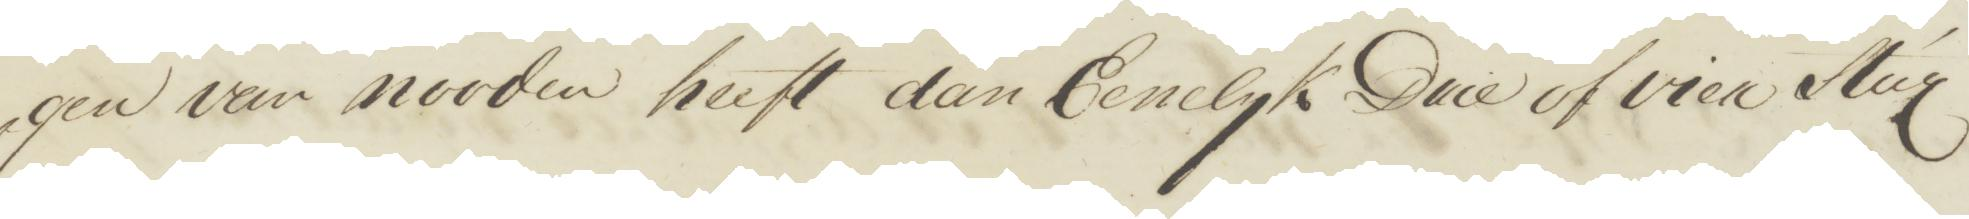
gen van nooden heeft dan Eenelyk Drie of vier stux
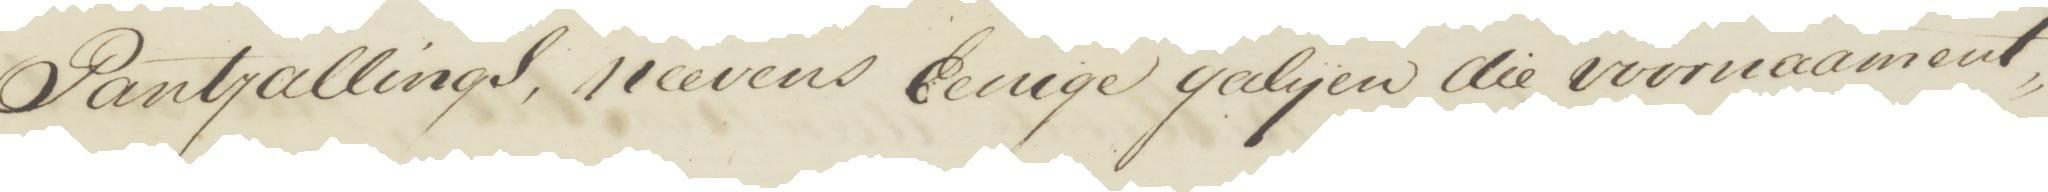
Pantjallings, neevens Eenige galijen die voornaament„
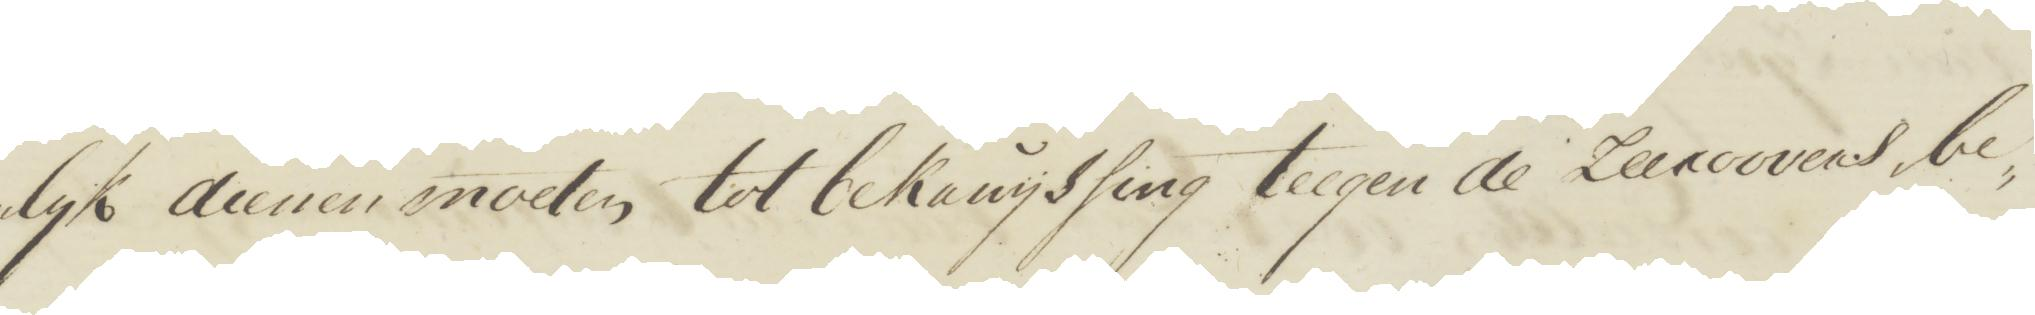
lijk dienen moeten tot bekruijssing teegen de zeeroovers be„
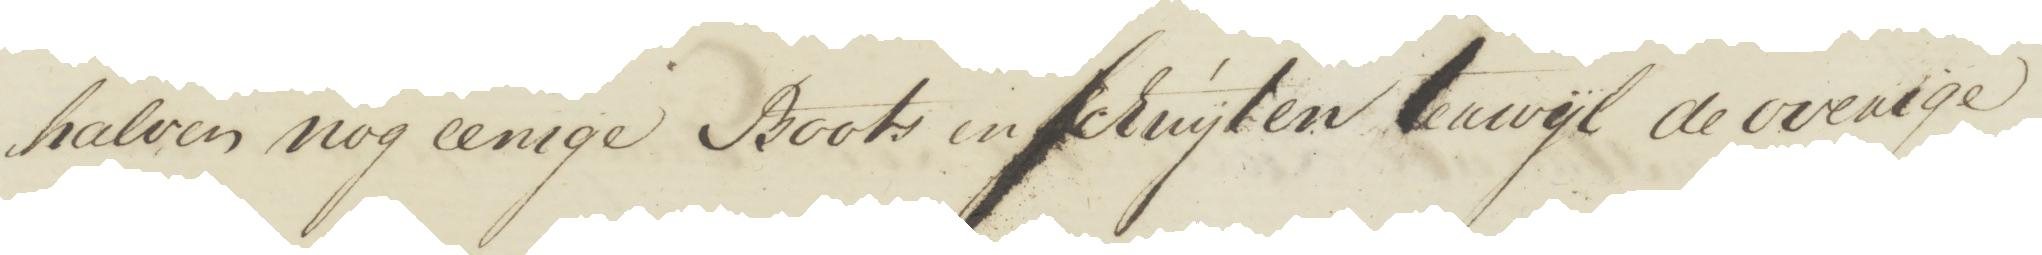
halven nog eenige Boots en schuijten terwijl de overige
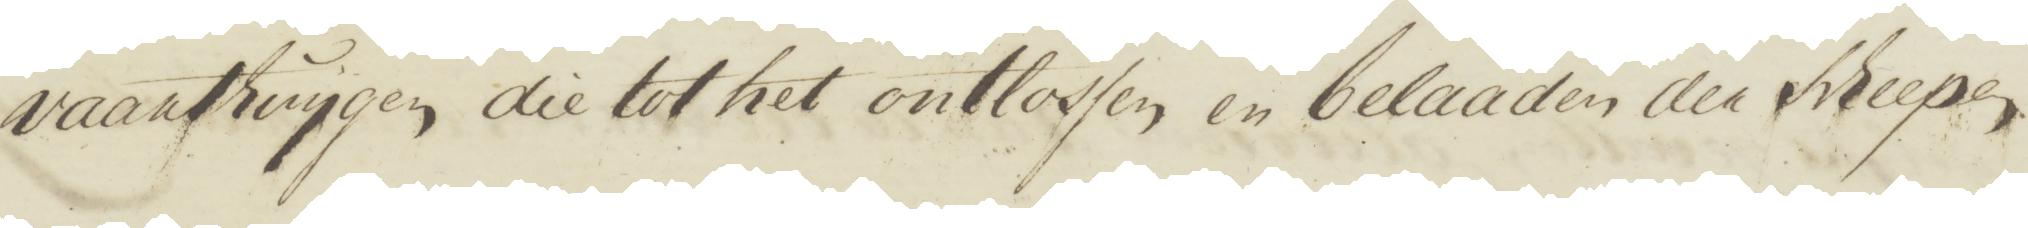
vaarthuijgen die tot het ontlossen en belaaden der scheepen
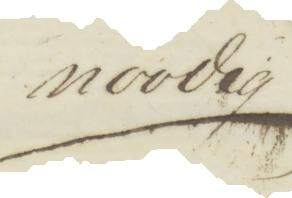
noodig
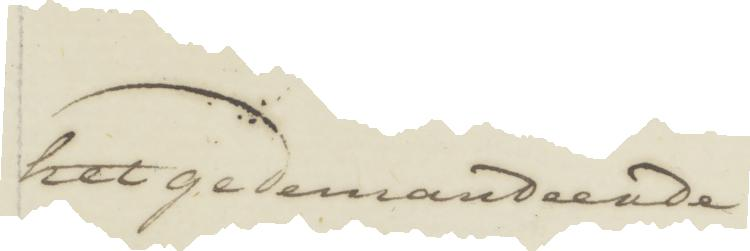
het gedemandeerde
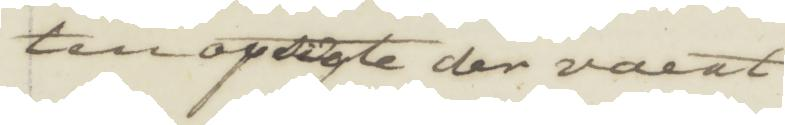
ten opsigte der vaert
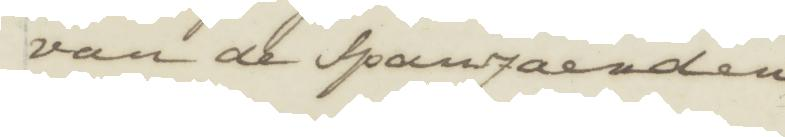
van de spanjaerden
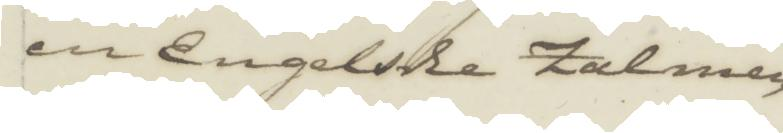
en Engelsche zal men
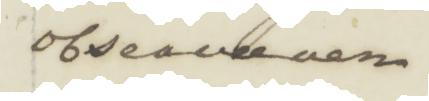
observeeren
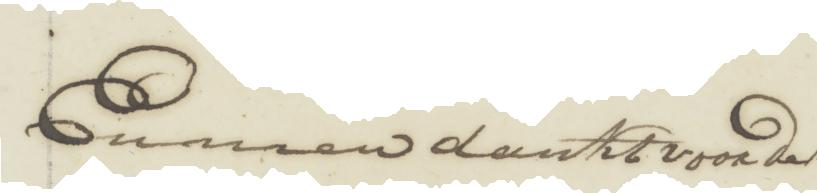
Enmen dankt voor dat
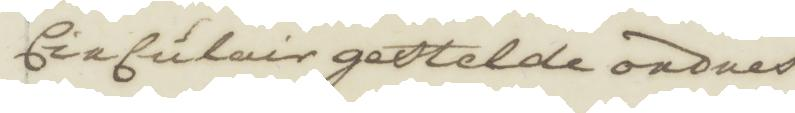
Circulair gestelde ordres
